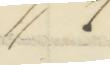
„ 7
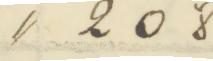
„ 208
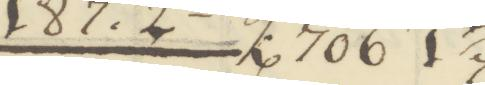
187. 2 k 706 1 1/7
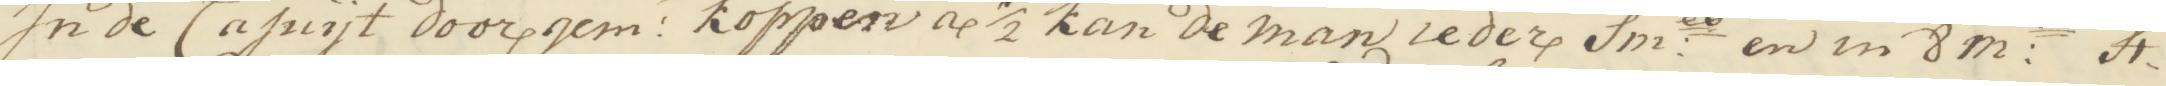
Jn de Cajuijt door gem: koppen a ½ kan de man ieder sm:es en in 8m:=n st
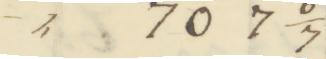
„ 707 6/7
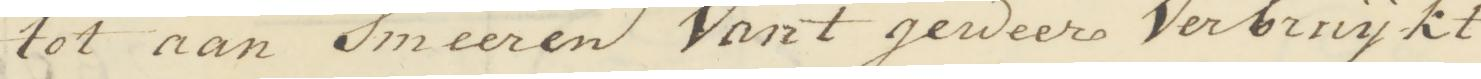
tot aan smeeren vant geweer verbruijkt
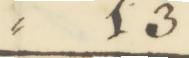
„ 13 –
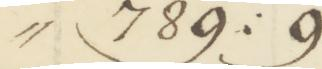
„ 789: 9
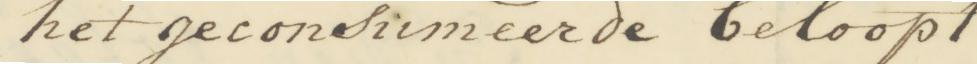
het geconsumeerde beloopt
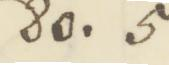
80. 5
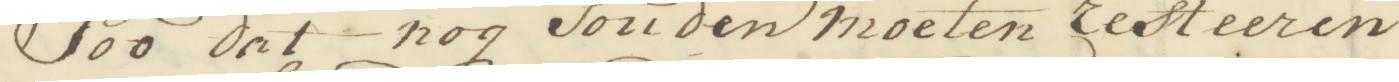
Soo dat nog souden moeten resteeren
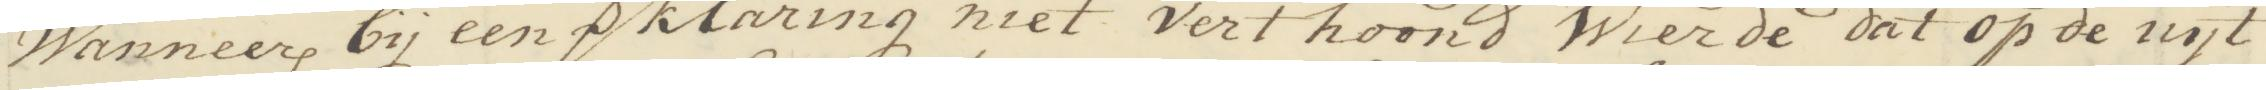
Wanneer bij een verklaring niet verthoond wierde dat op de uijt
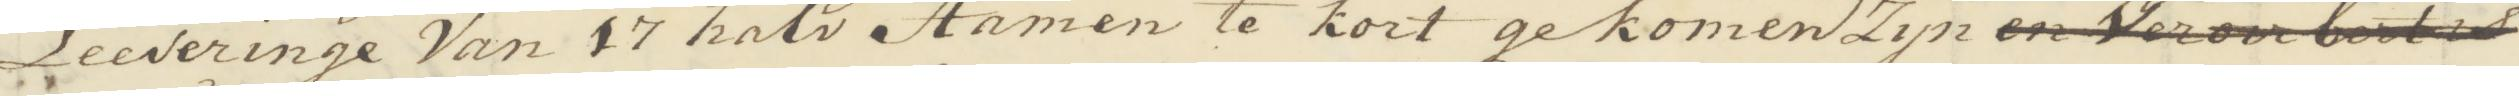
Leeveringe van 17 halv Aamen te kort gekomen zyn en veroirbert is
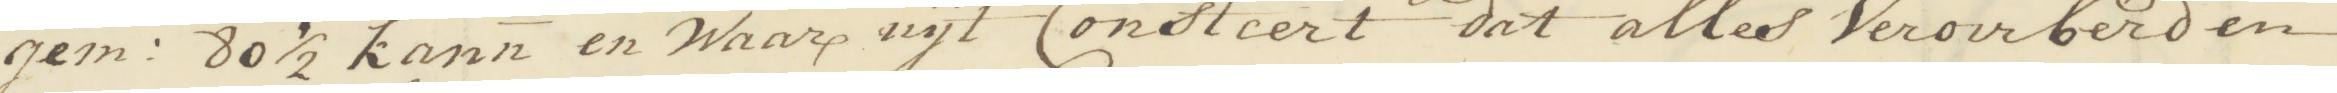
gem: 80½ kann en waar uijt consteert dat alles veroirberden
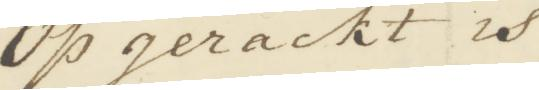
op gerackt is
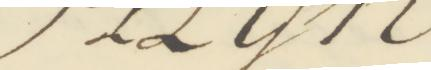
Azijn
